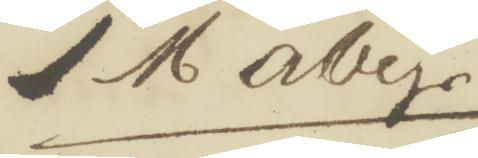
P Mabéjr
